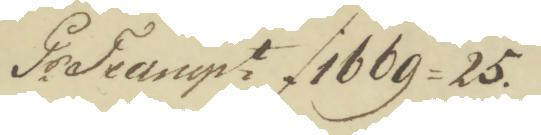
P„r Transp„t ƒ1669=25.
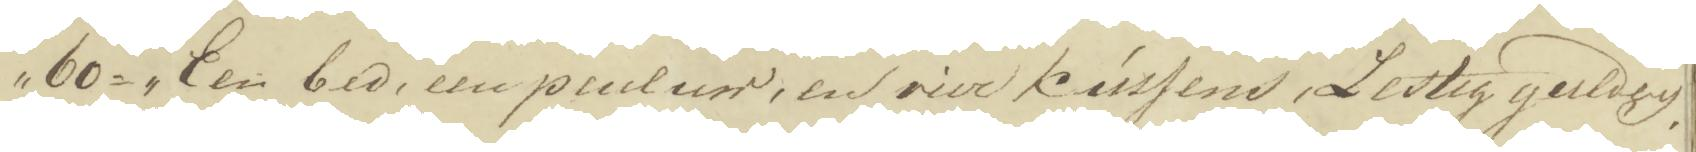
„60=„ Een bed, een peuluw, en vier kussens, Zestig gulden
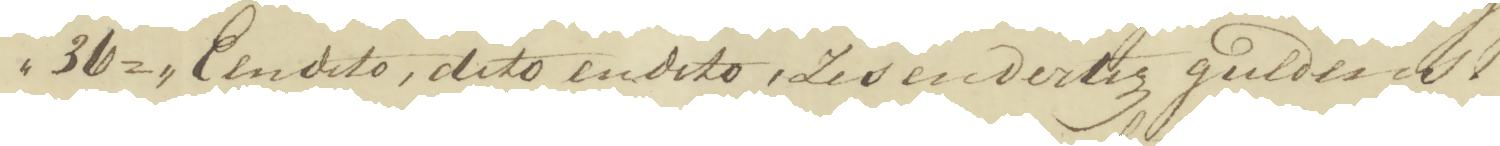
„36=„ Een dito, dito en dito, zes en dertig guldens.
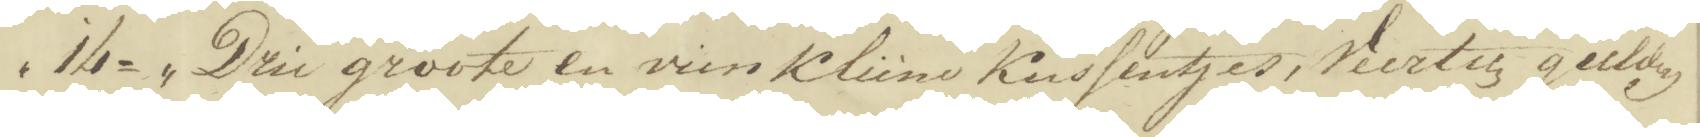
„14= „ Drie groote en vier kliine Kussentjes, Veertien gulden
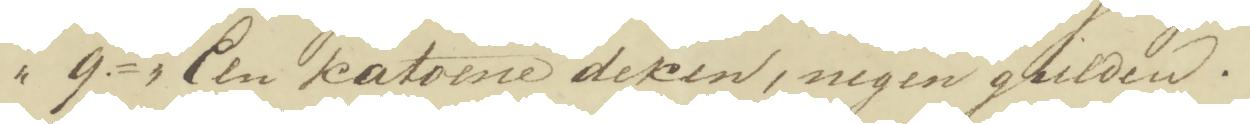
„ 9.=„ Een katoene deken, negen gulden.
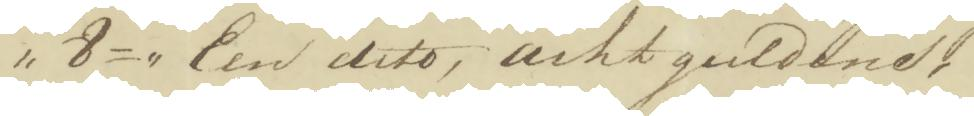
„ 8=„ Een dito, acht guldens,
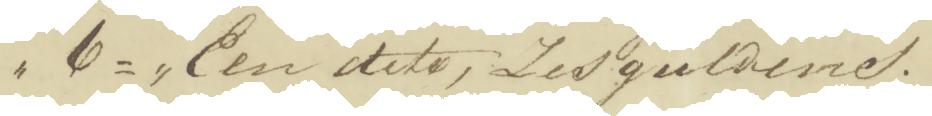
„ 6=„ Een dito, zes guldens.
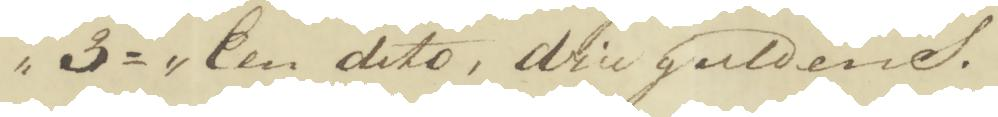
„ 3=„ Een dito, drie guldens.
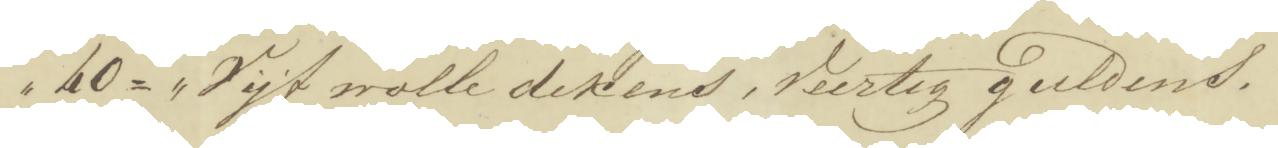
„ 40=„ Vijf wolle dekens, veertig guldens.
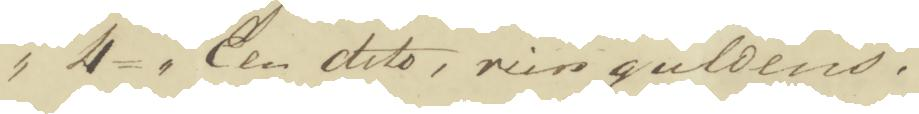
„ 4=„ Een dito, vier guldens.
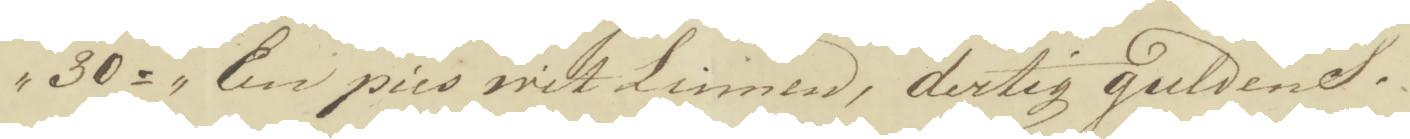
„ 30= „ Een pies wit Linnen, dertig guldens.
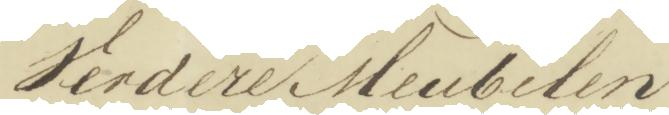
Verdere Meubelen
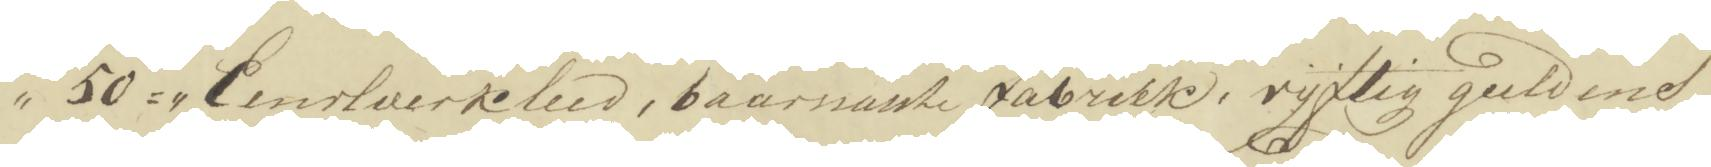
„ 50 =„ Een vloerkleed, baarnause fabriek, vijftig guldens
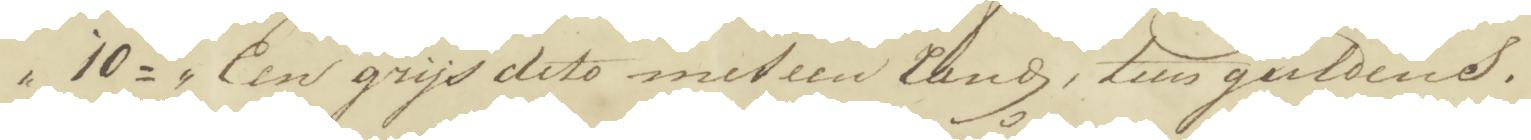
„ 10= „ Een grijs dito met een Rand, tien guldens.
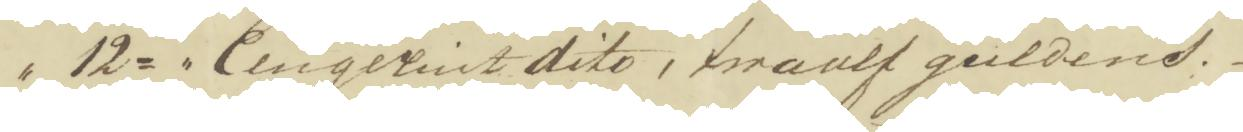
„ 12= „ Een geruit dito, twaalf guldens.
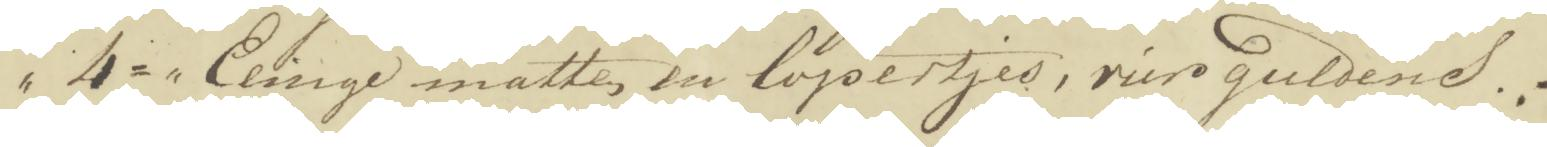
„ 4= „ Eenige matten en lopertjes, vier guldens..
